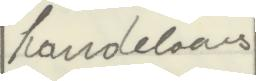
kandelaars
